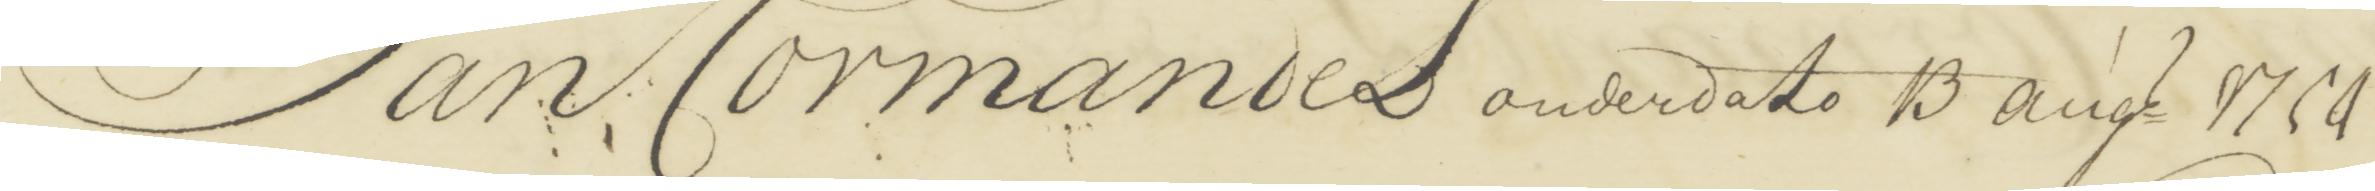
Van Cormandel onderdato 13 aug=s 1754
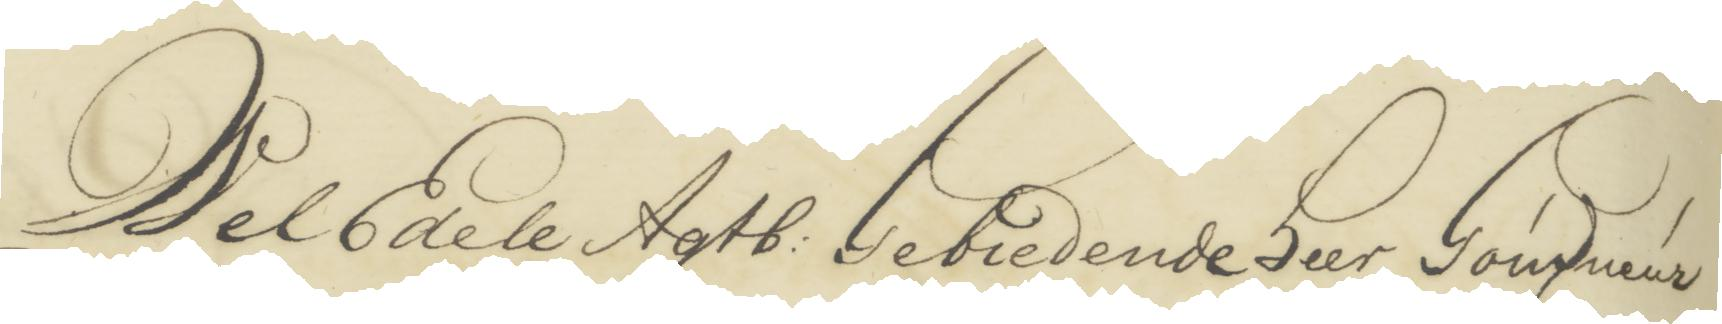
Wel Edele Agtb: Gebiedende Hier Gouverneur
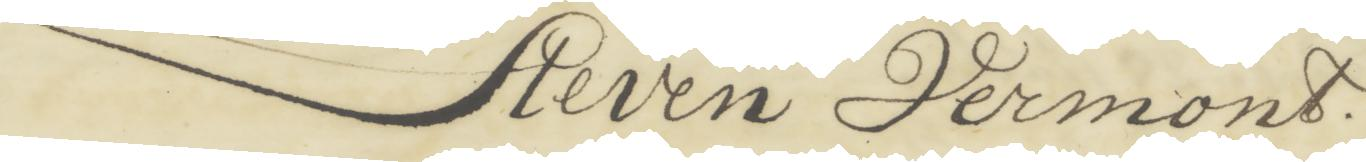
Steven Vermont.
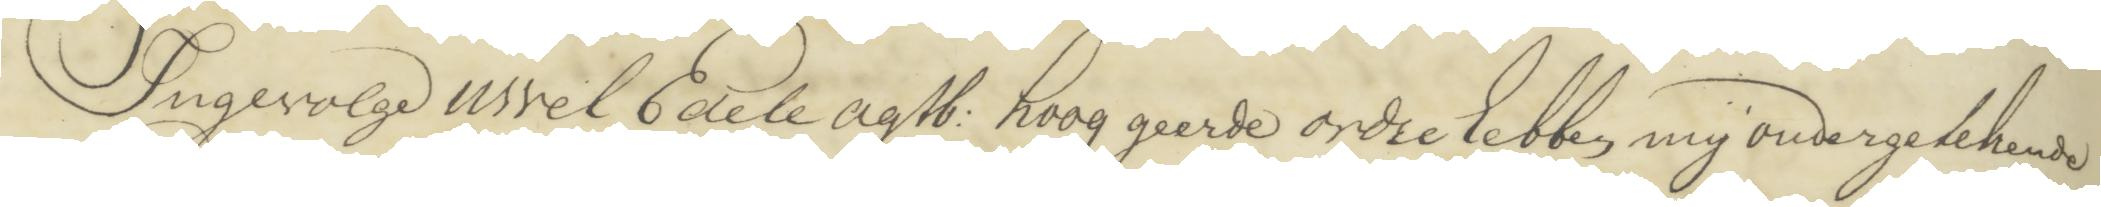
Ingevolge uwel Edele agtb: hoog geerde ordre hebben mij ondergetekende
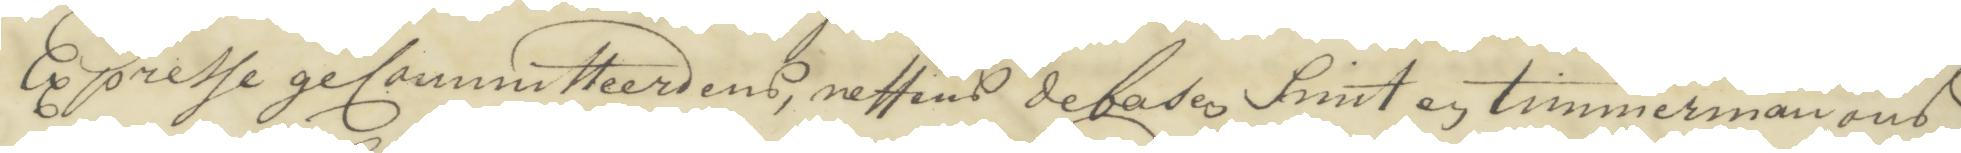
Expresse gecommitteerdens, neffins de basen Smit en timmerman ons
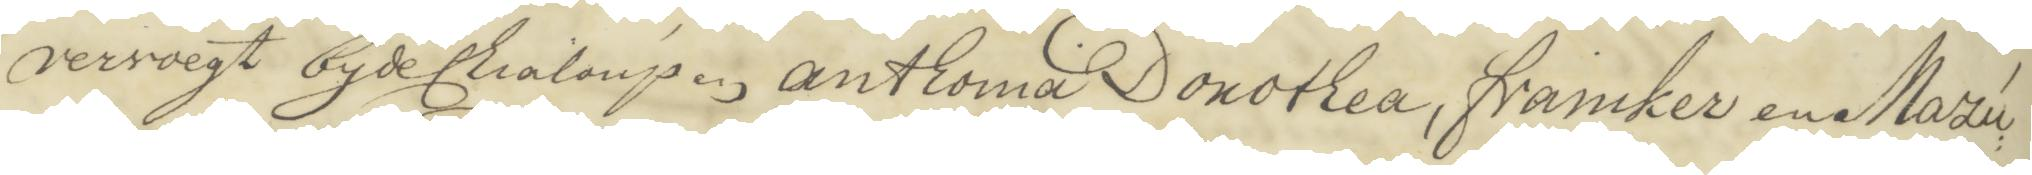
vervoegt by de Chialoup en anthonia Dorothea, franiker en Mazu„
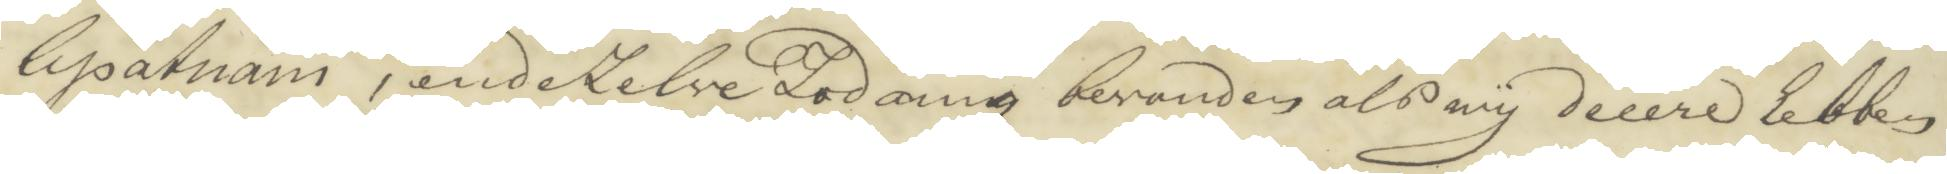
lipatnam, en de Zelve Zodanig bevonden als wij de eere hebben
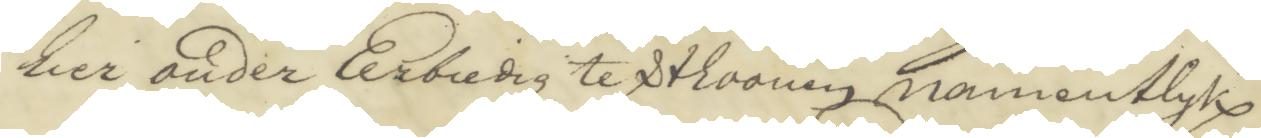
hier onder Eerbiedig te verthoonen namentlyk
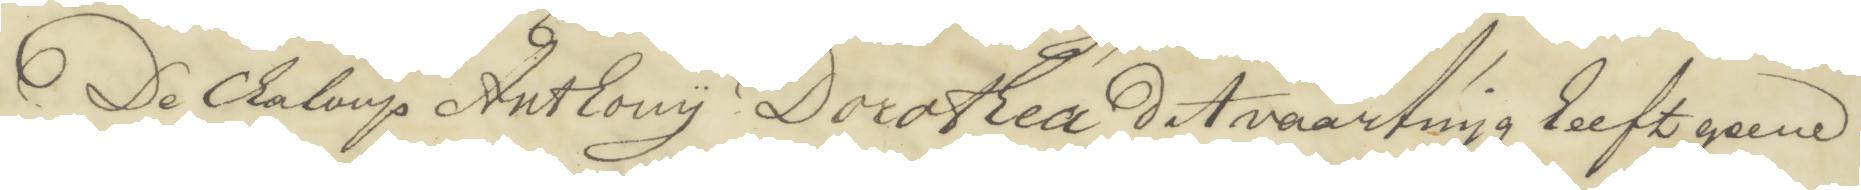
De Chaloup Anthonij Dorothea dit vaartuijg heeft geene
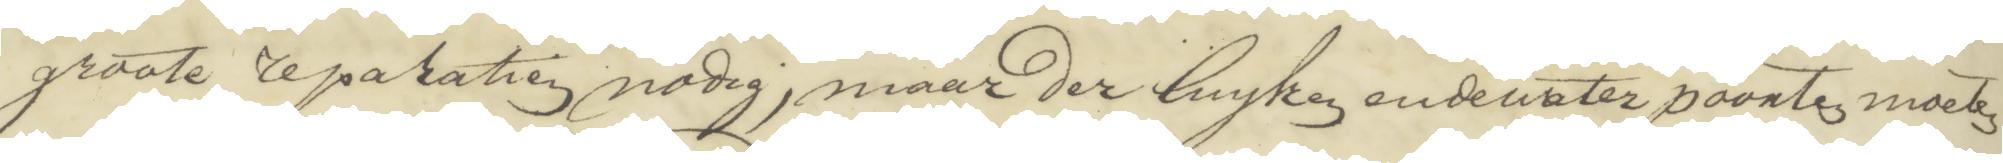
groote reparatien nodig, maar der luyken en de water poorten moeten
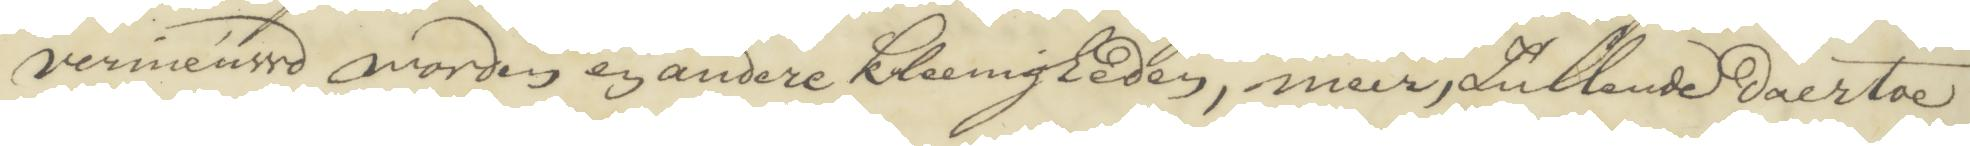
vernieuwd worden en andere kleenigheden, meer, Zullende daertoe
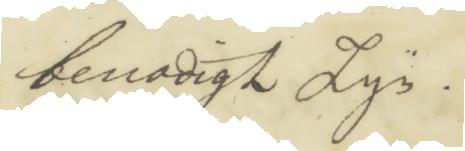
benodigt Zijn.
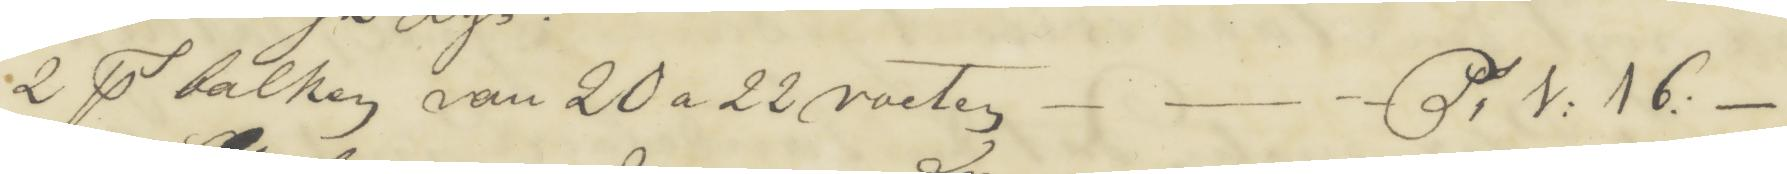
2 ps balken van 20 a 22 voeten ——— — P„s 1: 16: —
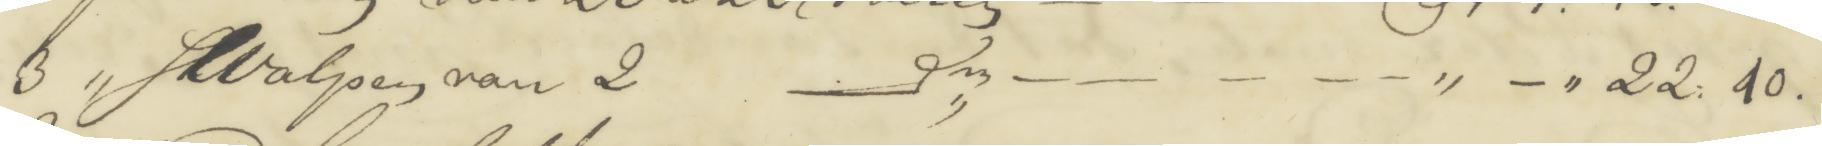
3 „ Swalpen van 2 D„m ————— „ 22: 40.
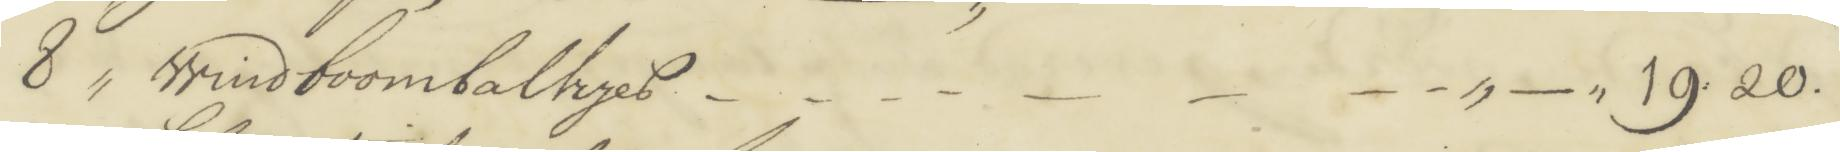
8 „ windboombalkjes - - - -— — — „ — „ 19: 20.
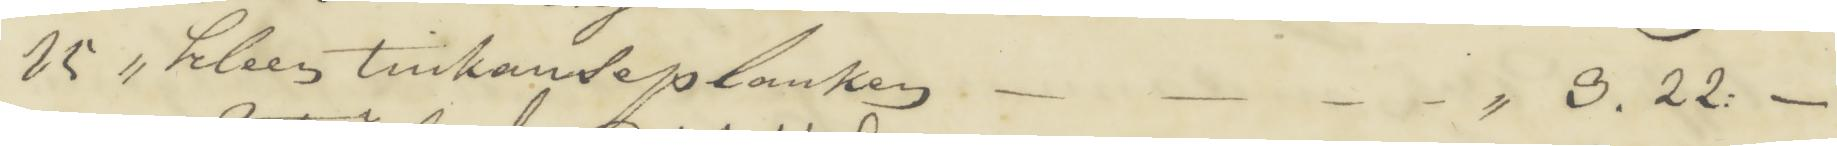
15 „ kleen tinkanse planken ———— „ 3. 22: —
